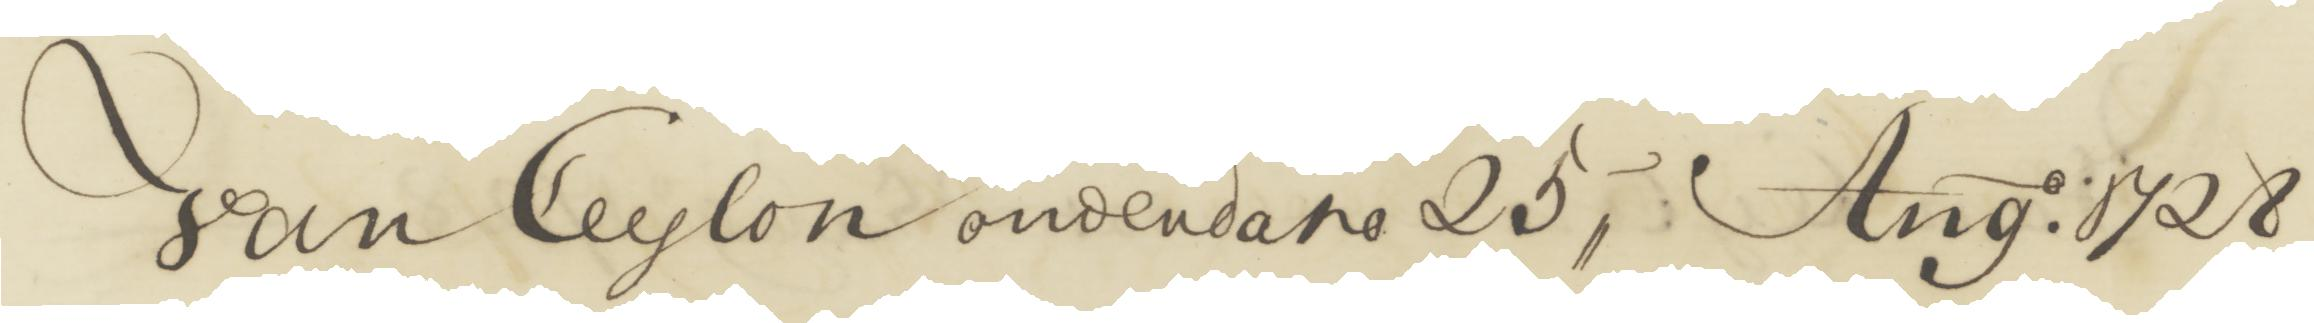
Van Ceijlon onder dato 25„': Aug:o 1728
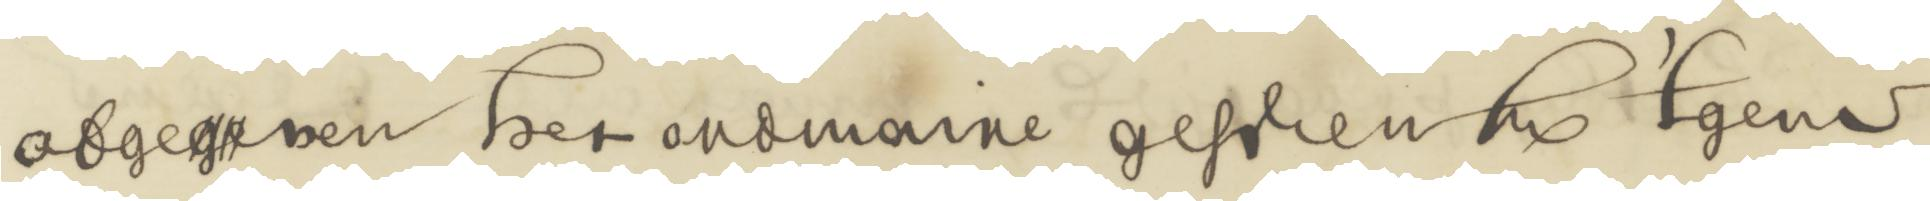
afgegeven het ordinaire geschenk 'tgene
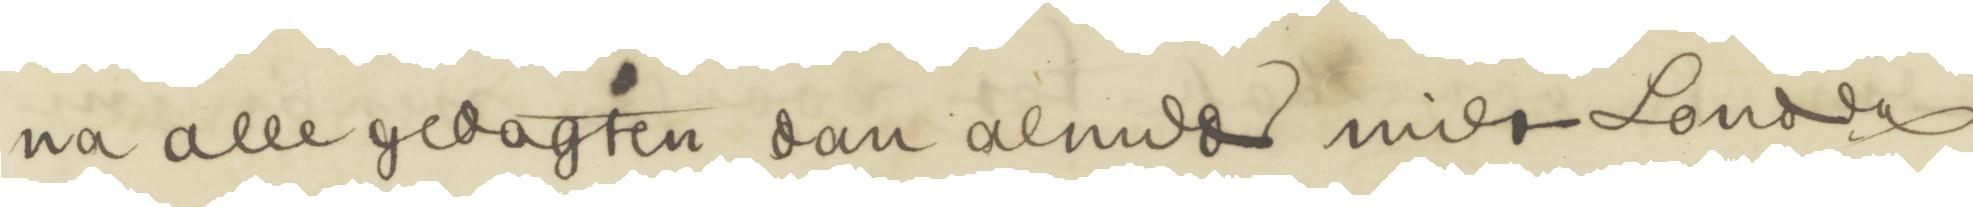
na alle gedagten dan almede niet sonder
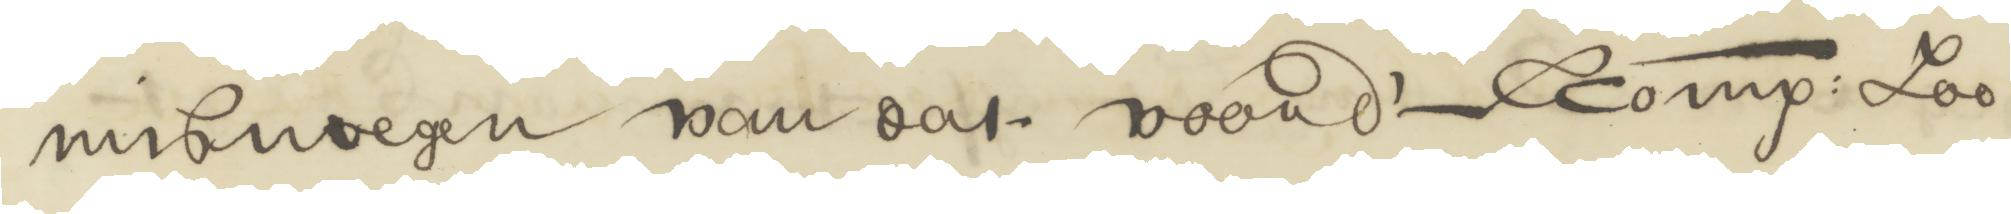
misnoegen van dat voor d’Ecomp: zoo
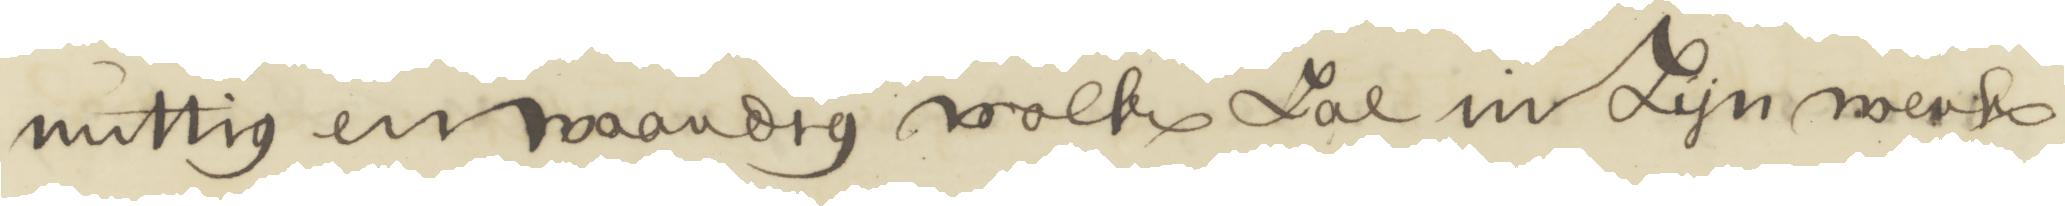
nuttig en waardig volk zal in zijn werk
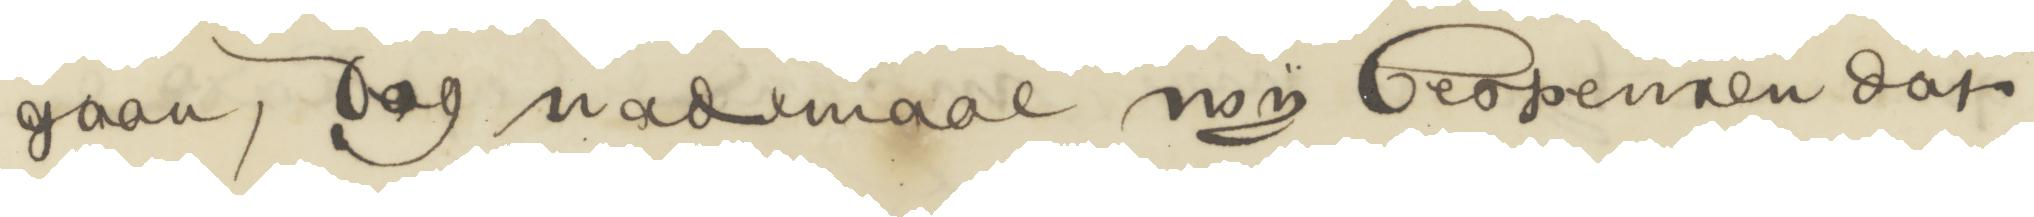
gaan, dog nademaal wij bespeuren dat
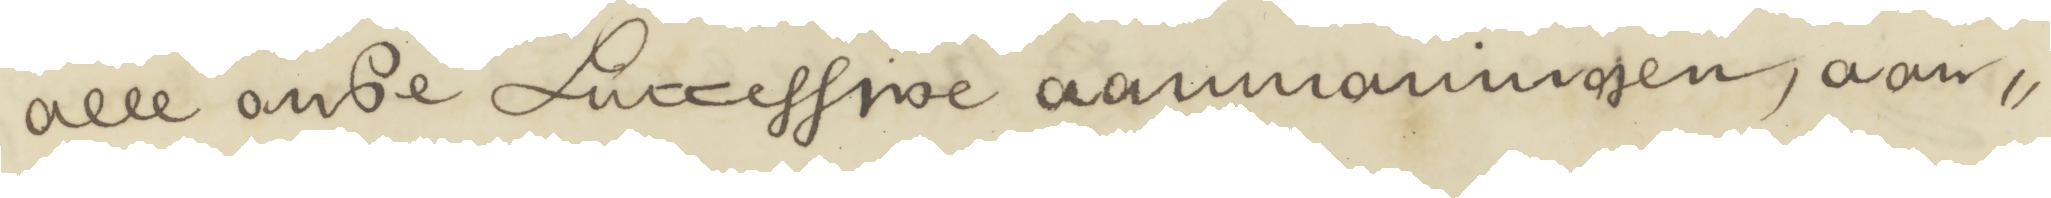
alle onse successive aanmaningen, aan„
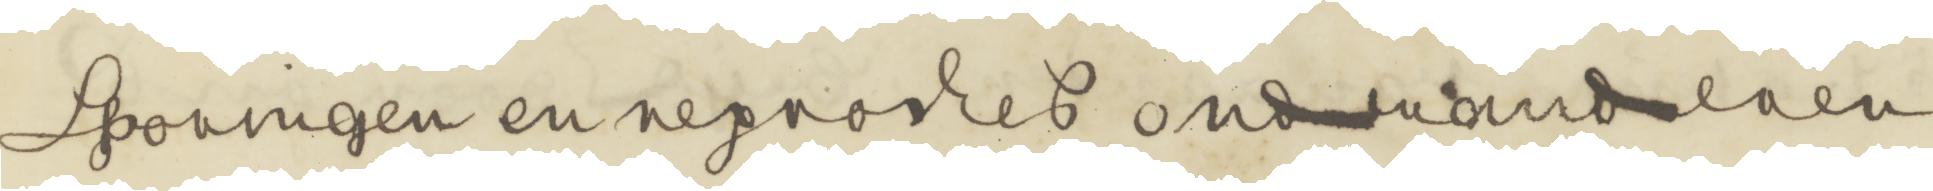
sporingen en reproches onder anderen
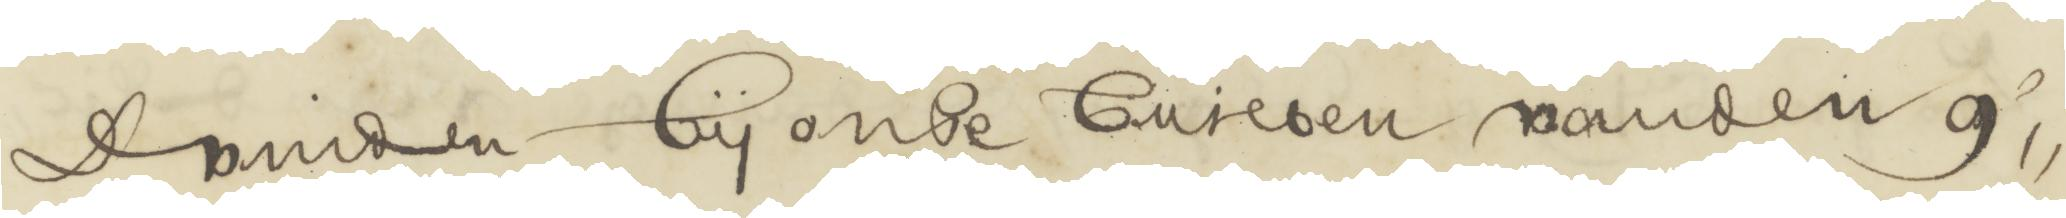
te vinden bij onse brieven vanden 9„'
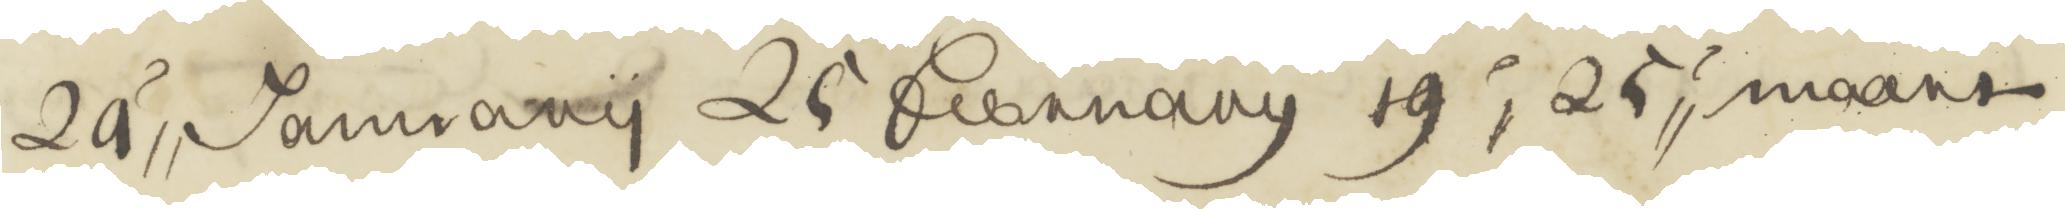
24„' Ianuarij 25 februarij 19„' 25„' maart
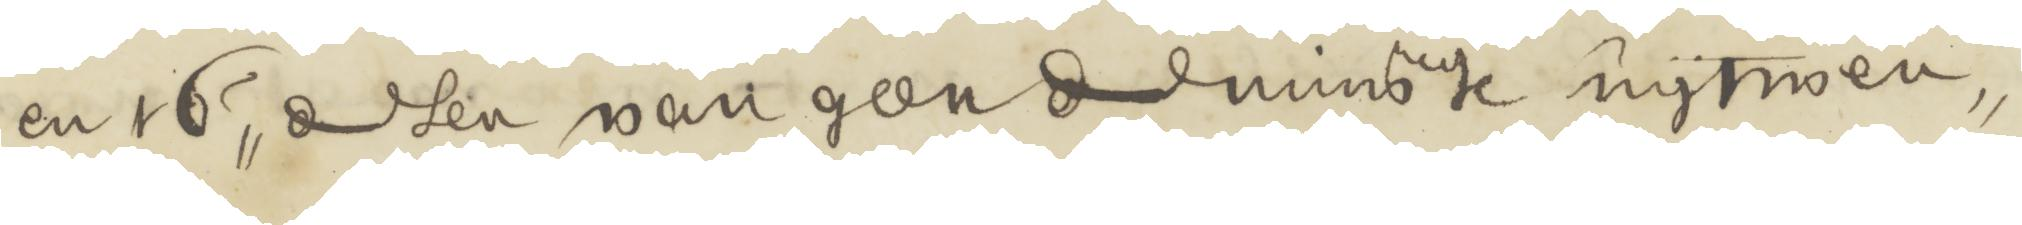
en 16„' deser van geen de minste uijtwer„
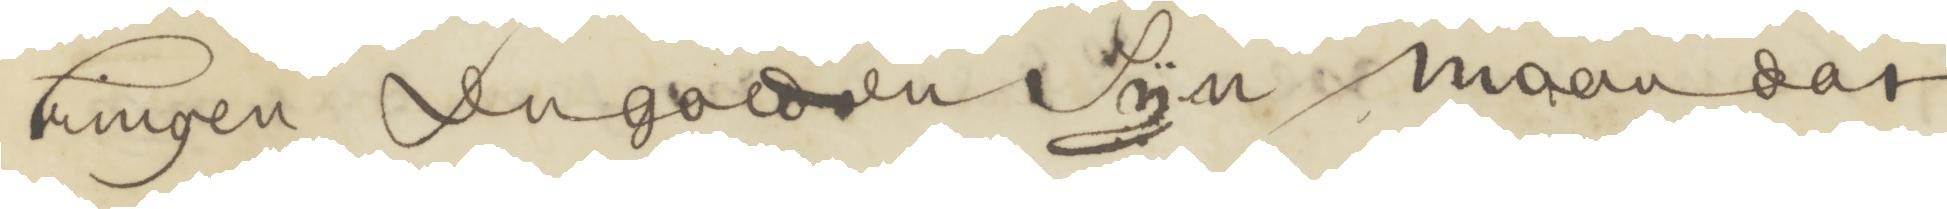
kingen ten goeden sijn maar dat
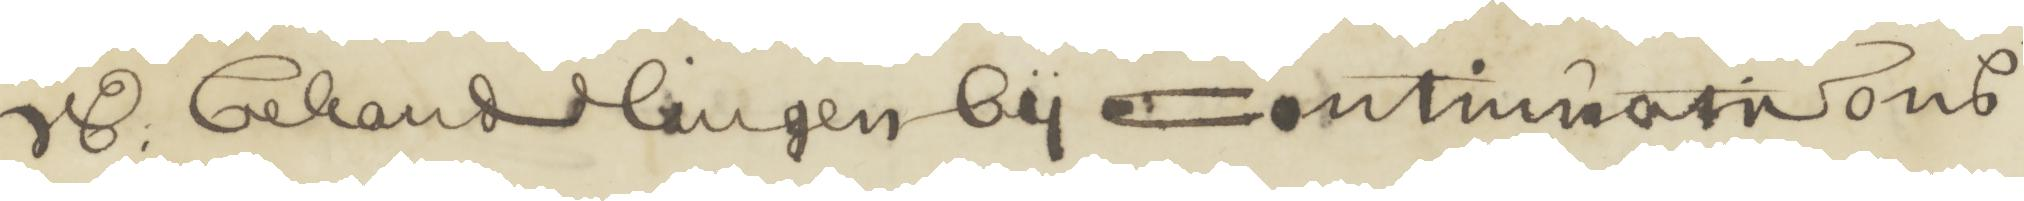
VE: behandelingen bij continuatie ons
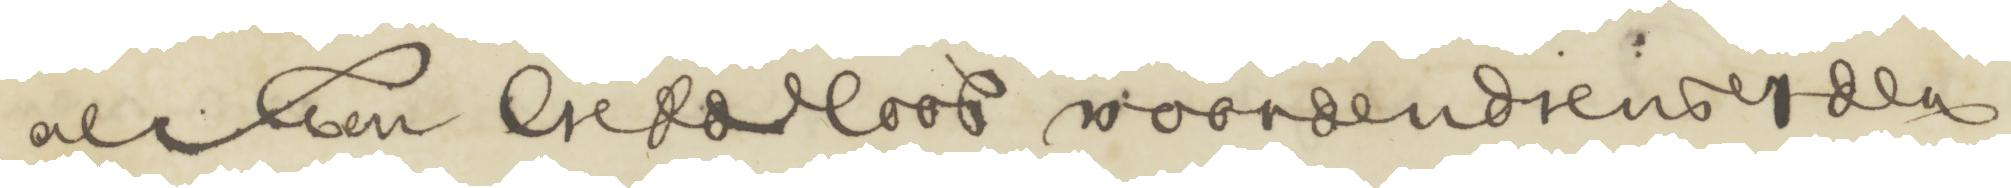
al Even liefdeloos voor den dienst der
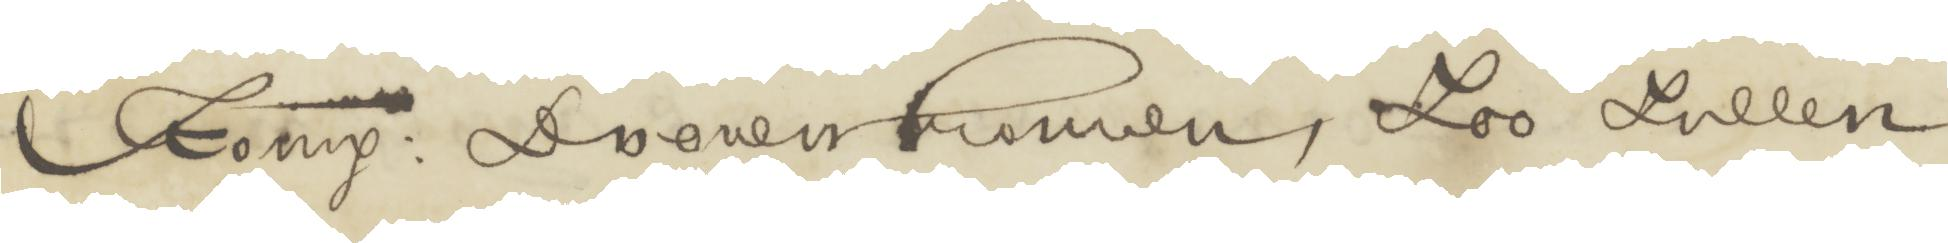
Ecomp:s tevoren komen, zoo zullen
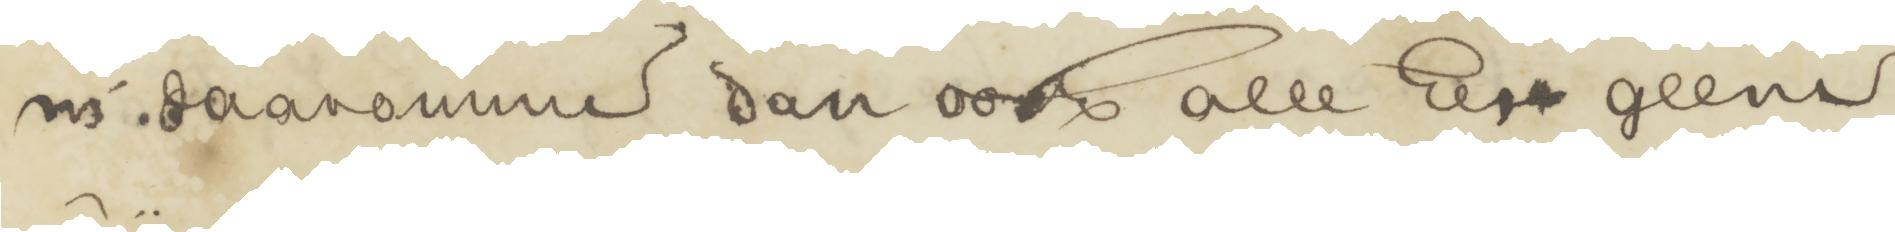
w' .daaromme dan ook alle hett geene
